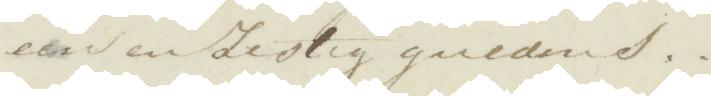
een en Zestig guldens.
